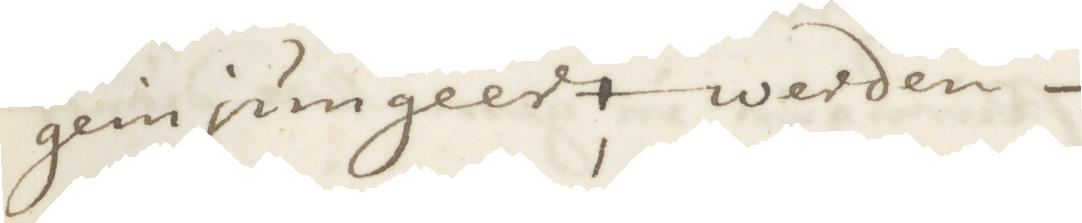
geinjungeert werden —
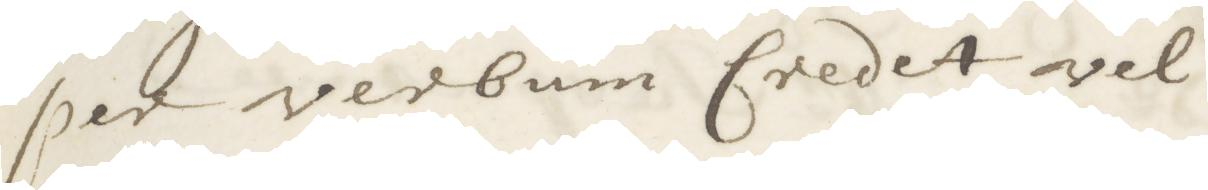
per verbum Credit vel
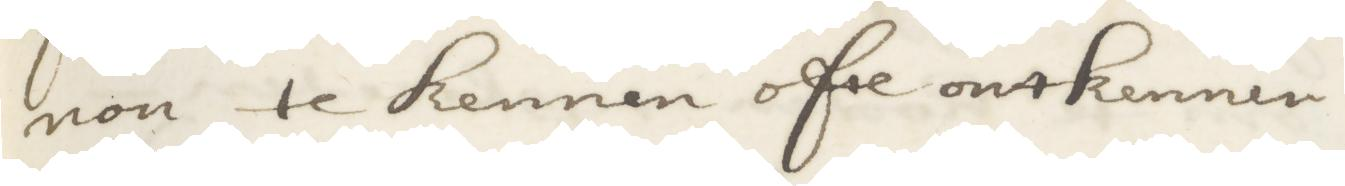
non te kennen ofte ontkennen
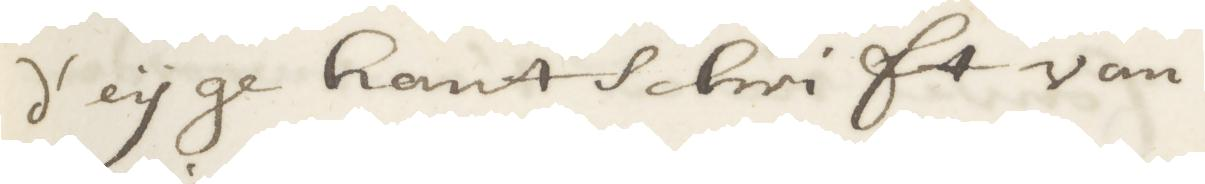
d’ eijge hantschrift van
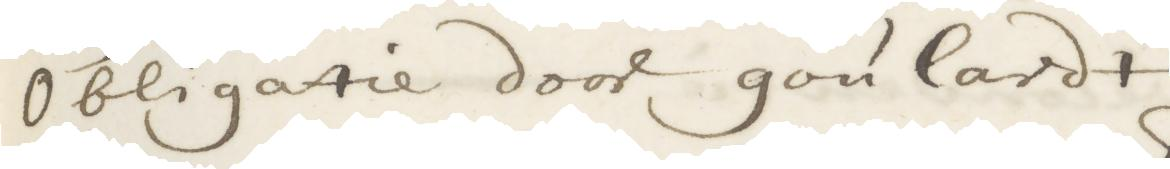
obligatie door goulardt
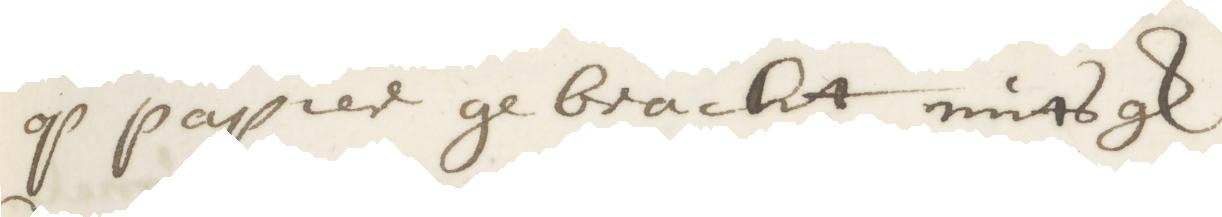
op papier gebrackt mitsg
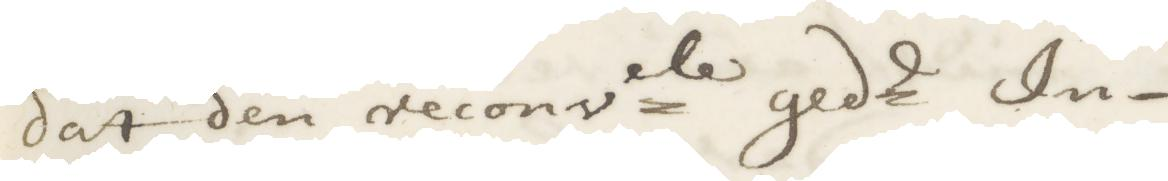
dat den reconv=ele ged=e In —
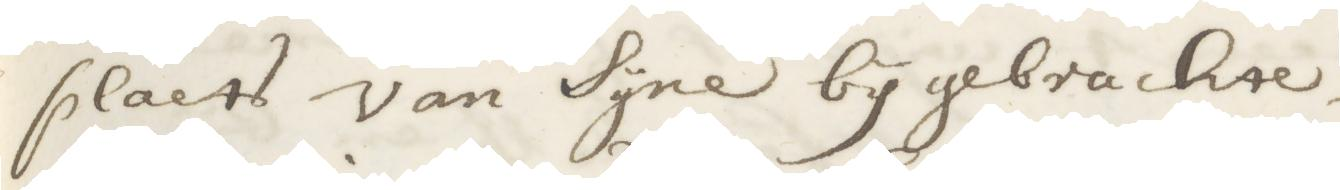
plaets van sijne bij gebrachte
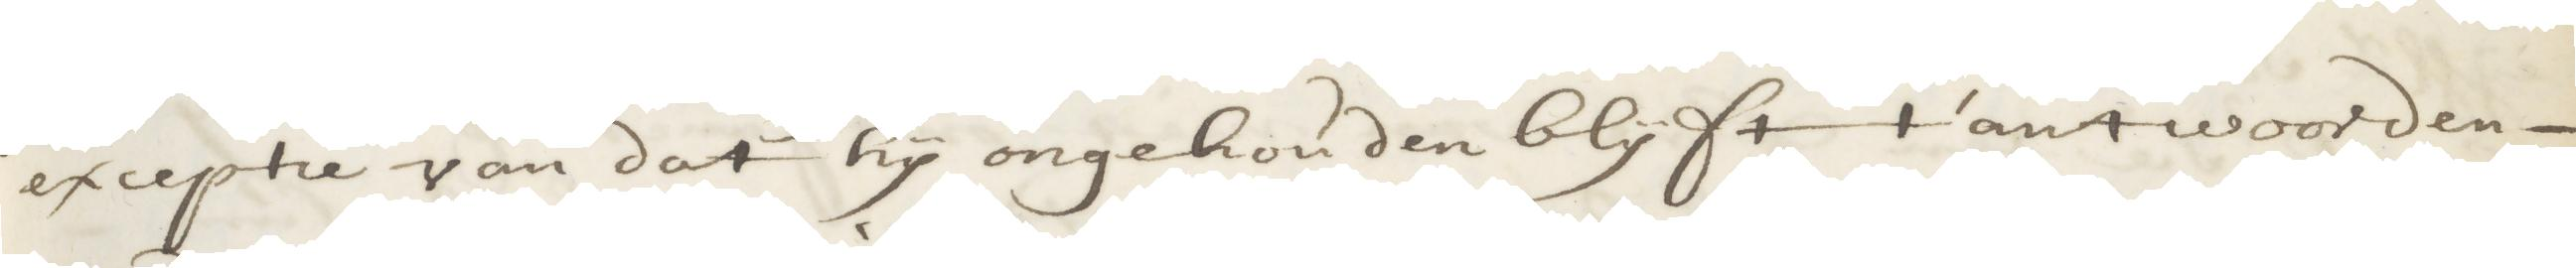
exceptie van dat hij ongehouden blijft t' antwoorden —
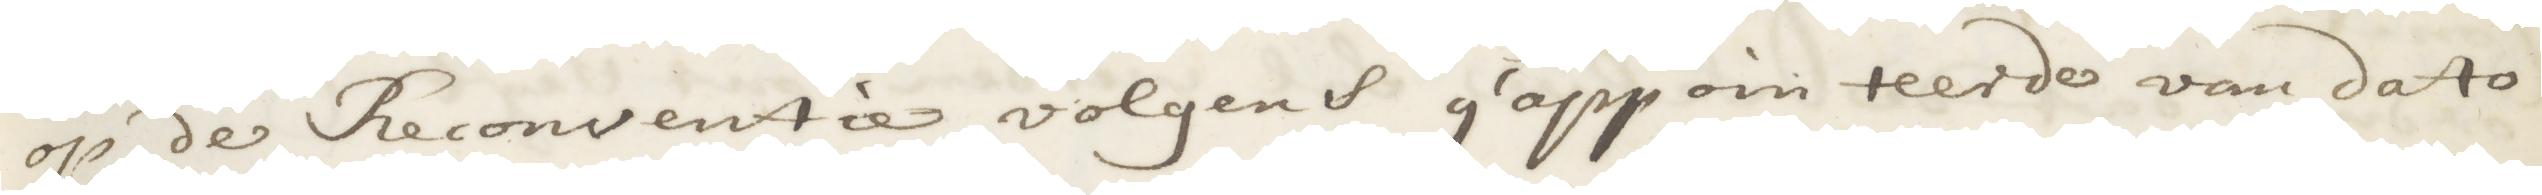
op de Reconventie volgens g'appoincteerde van dato
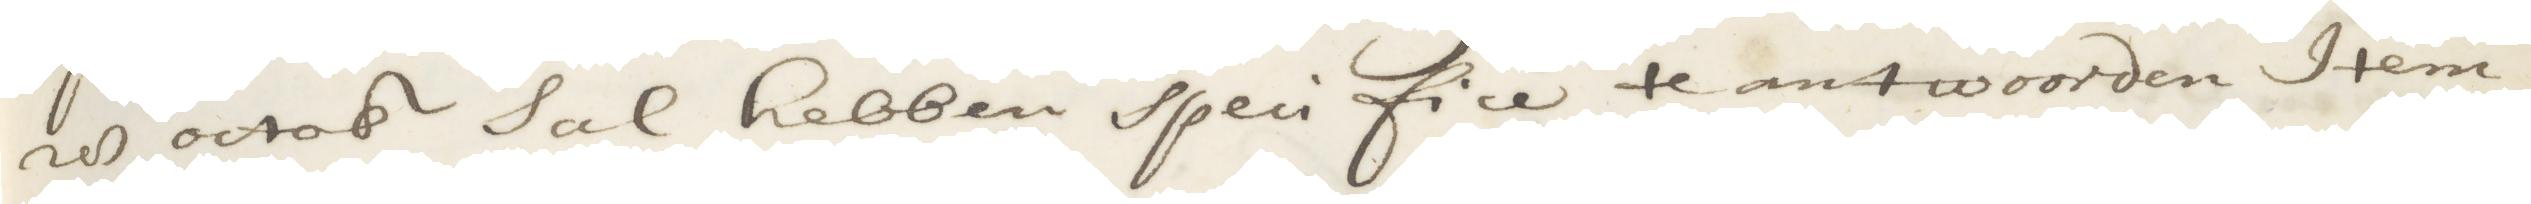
28 octob sal hebben speci fice te antwoorden Item
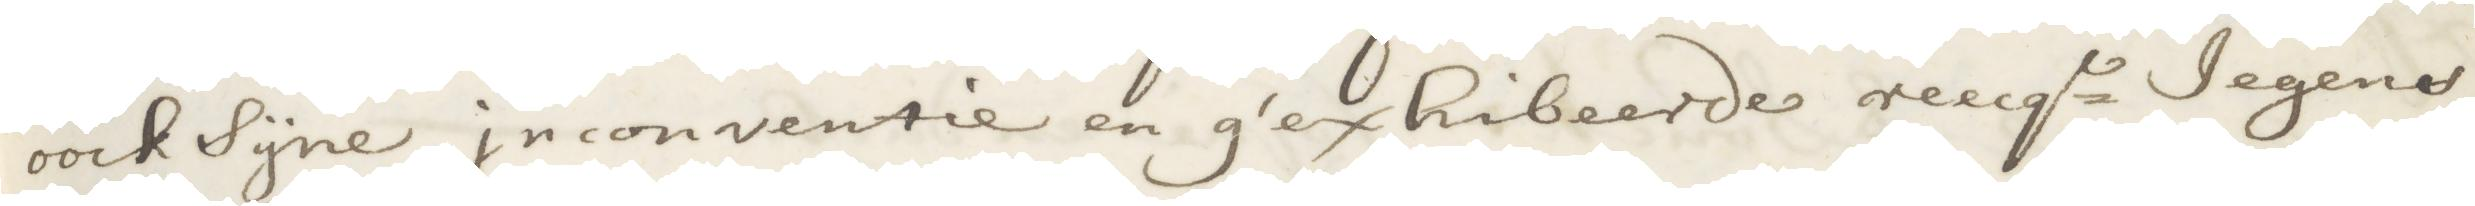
oock sijne jnconventie en g’exhibeerde reecq=t Jegens
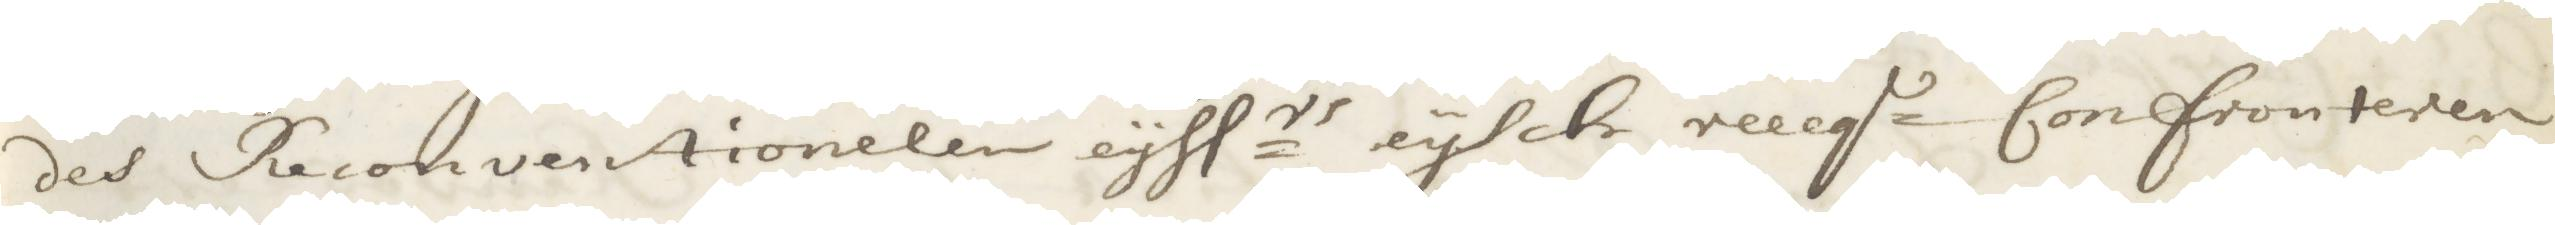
des Reconventionelen eijss=rs eijsch reecq=t Confronteren
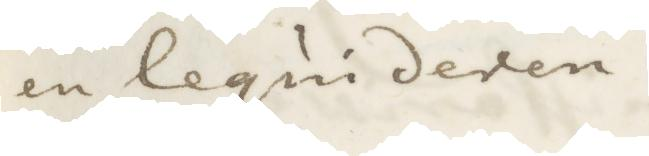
en lequideren
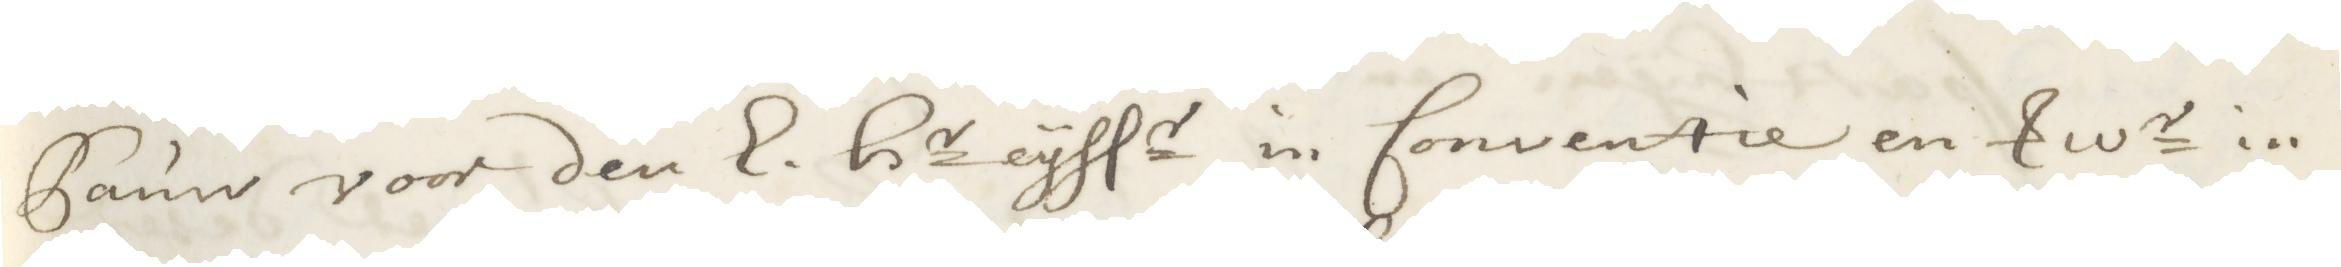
Pauw voor den E. H=r eijss=r in Conventie en verw=r in
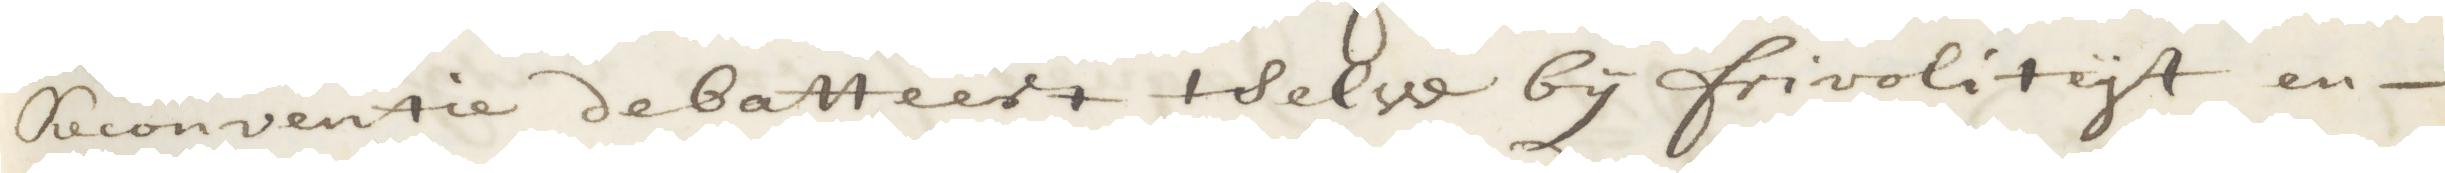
Reconventie debatteert tselve bij frivoliteijt en —
